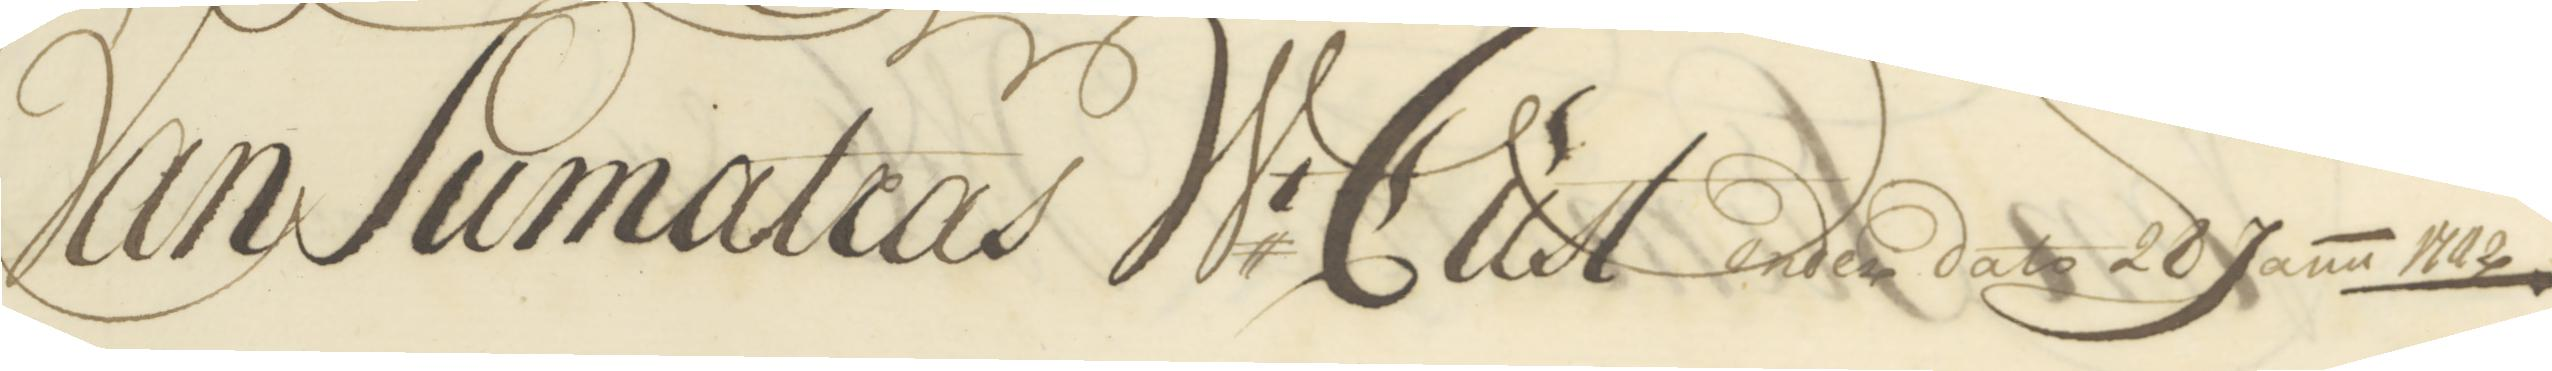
Van Sumatras W„t Cust onder dato 28 Jann 1742
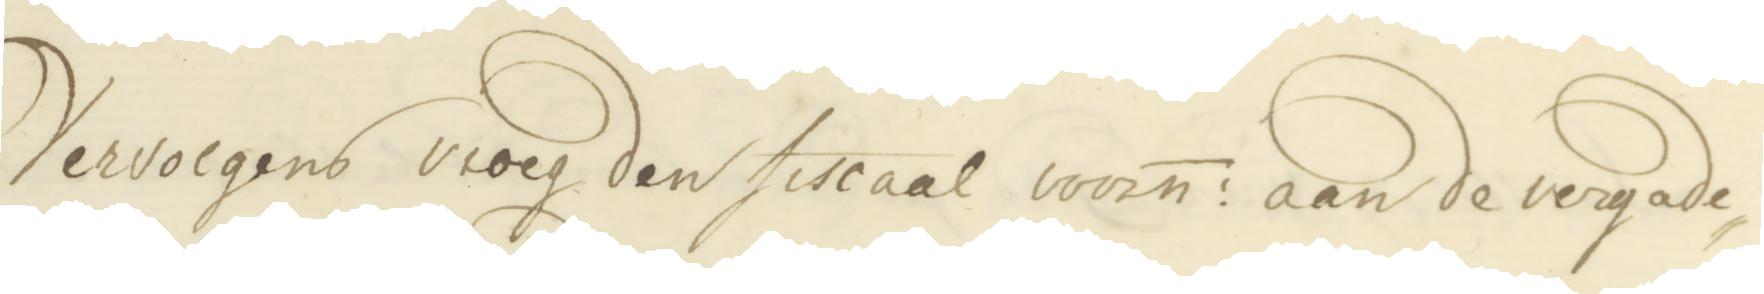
Vervolgens vroeg den fiscaal voorn: aan de vergade„
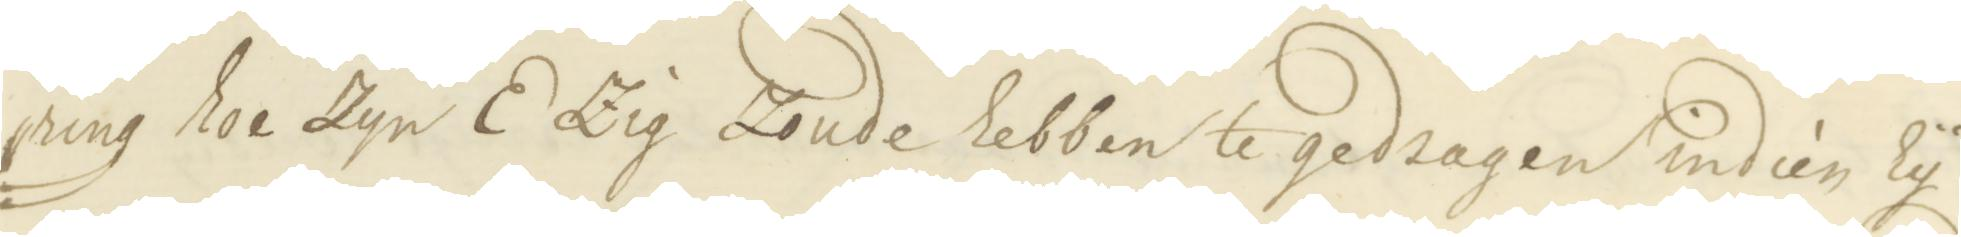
„ring hoe zyn E zig zoude hebben te gedragen indien hij
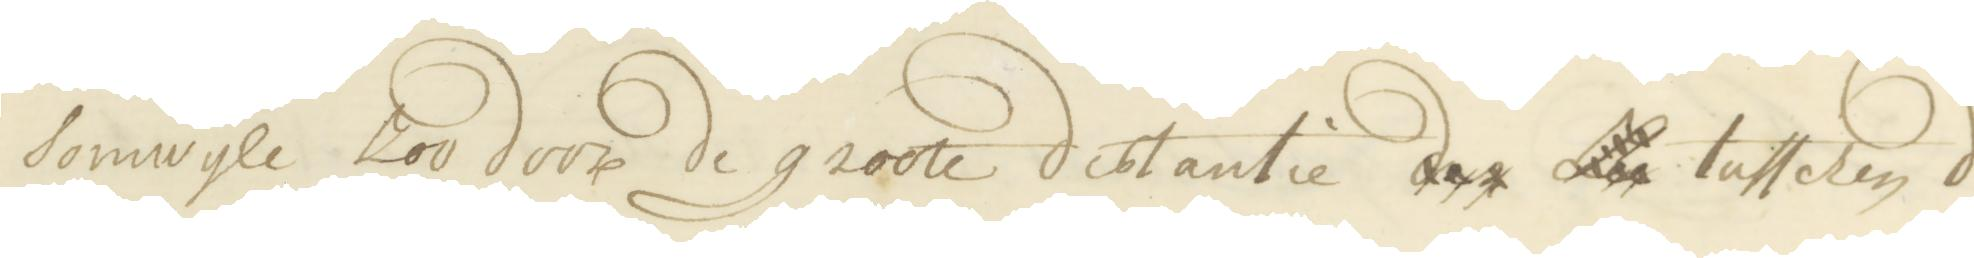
somwijle zoo door de groote distantie der zoo tusschen d
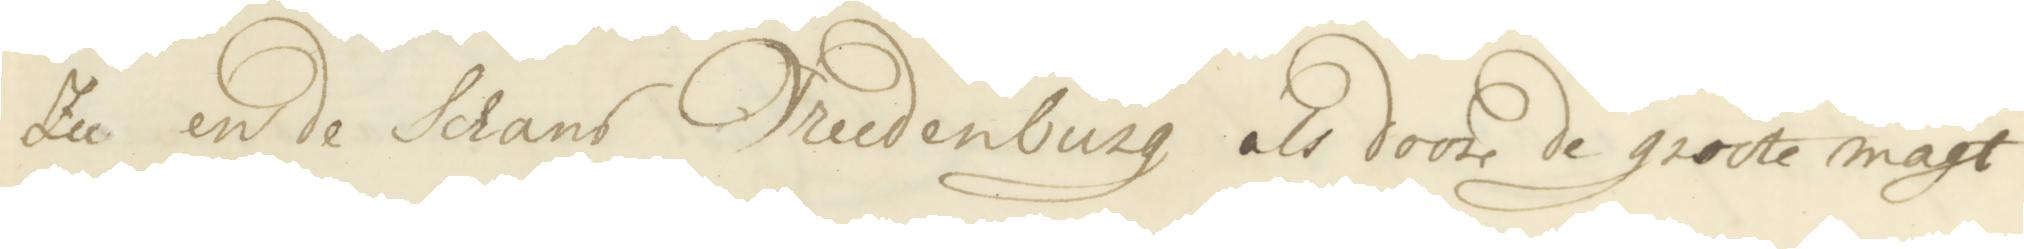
zee en de schans Vreedenburg als door de groote magt
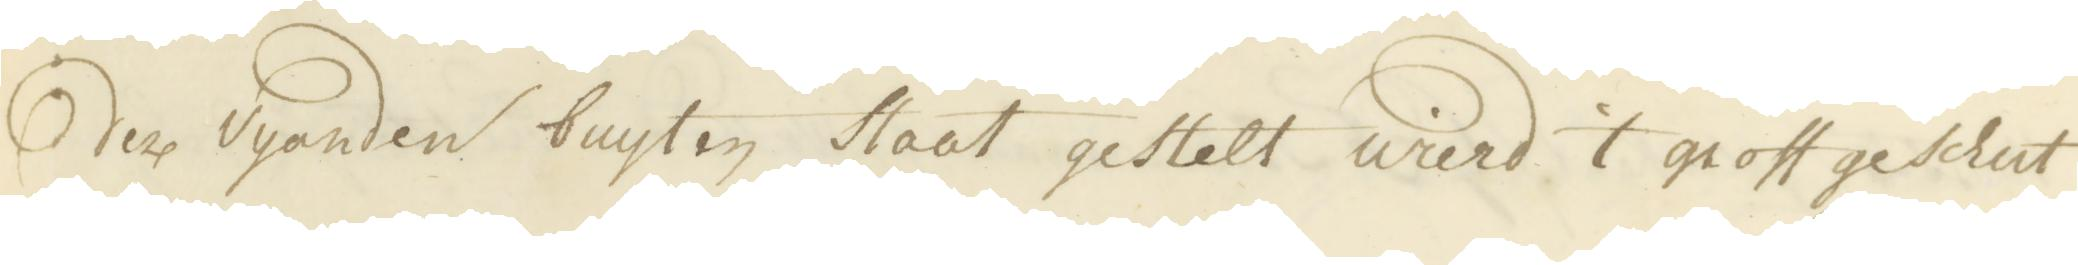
der vyanden buyten staat gestelt wierd ’t groff geschut
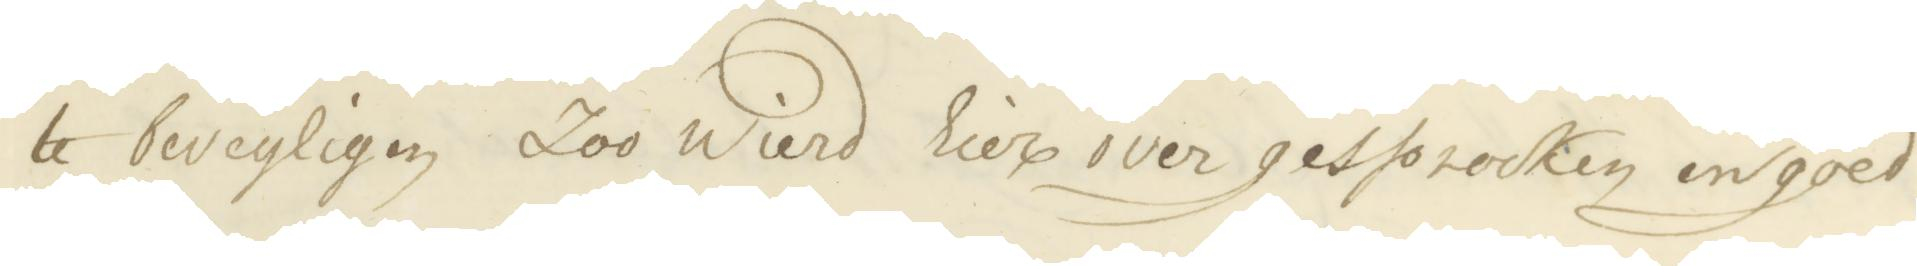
te beveijligen zoo wierd hier over gesprooken en goed
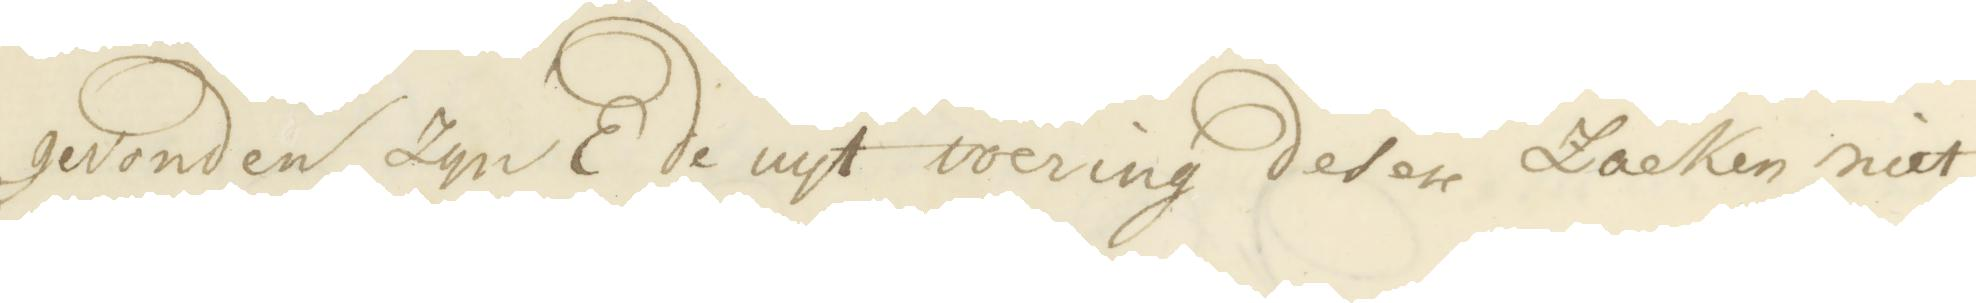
gevonden zyn E de uyt voering deser zaeken niet
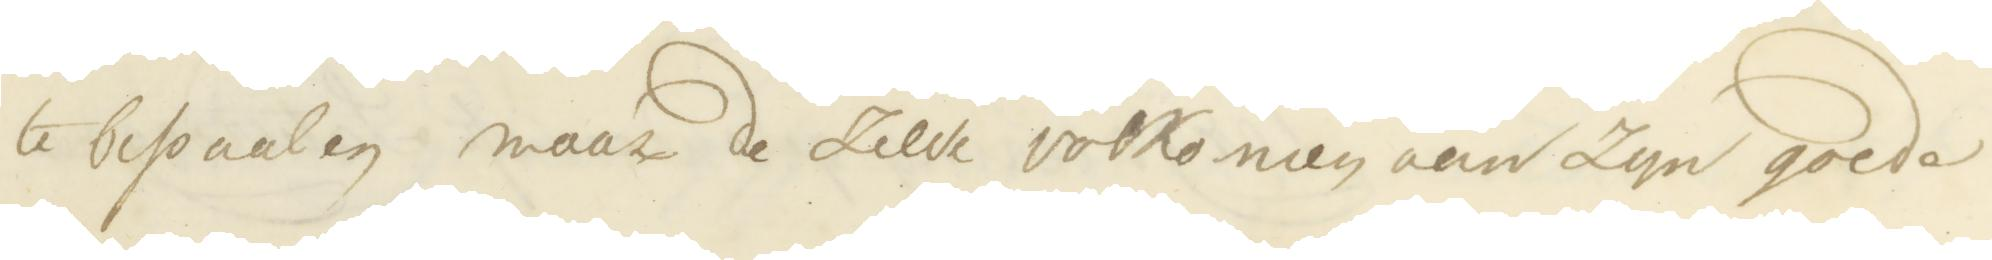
te bepaalen waar de zelve volkomen aan zyn goede
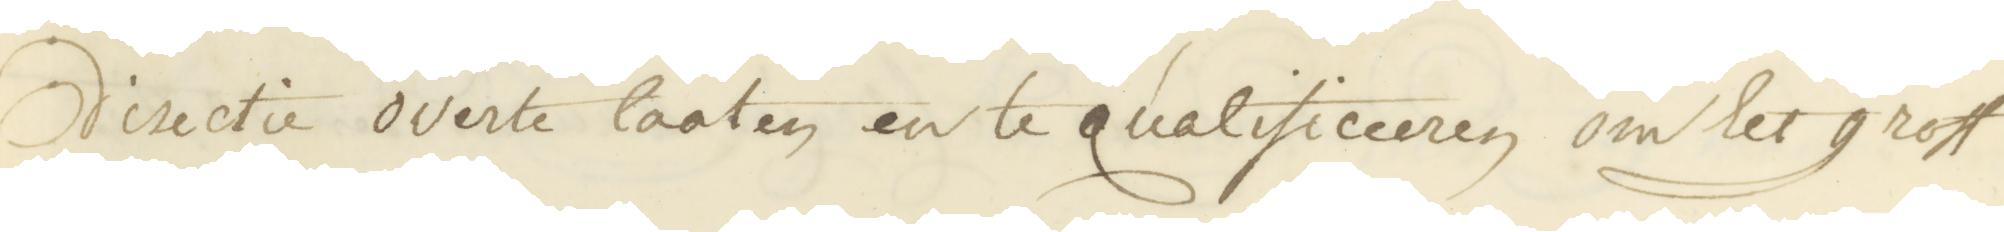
directie overte laaten en te qualificeeren om het groff
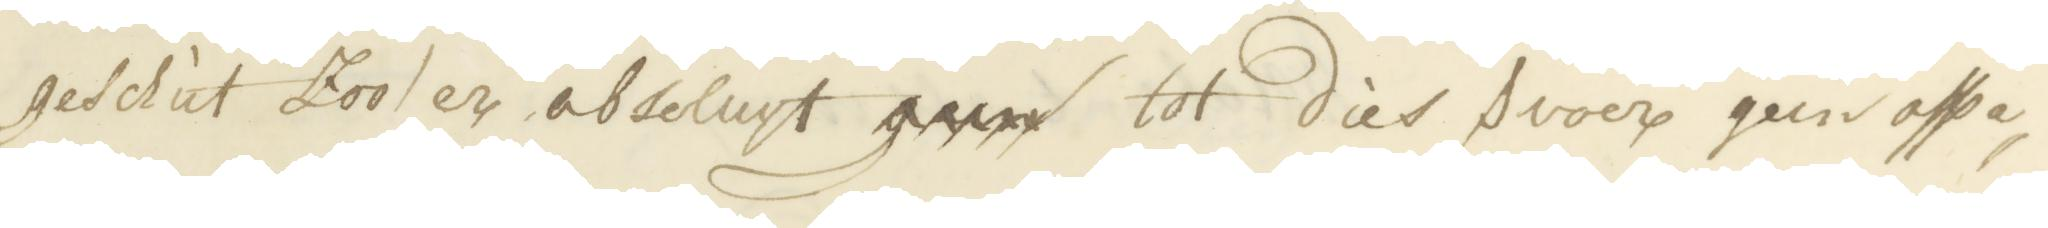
geschut zoo /er, abseluyt geen/ tot dies vervoer geen oppa„
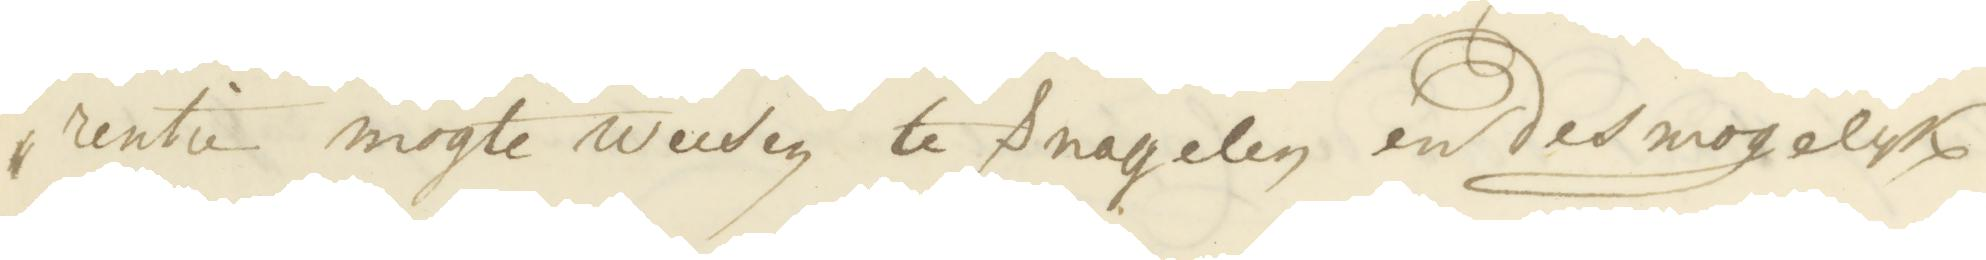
„rentie mogte weesen te vernagelen en des mogelijk
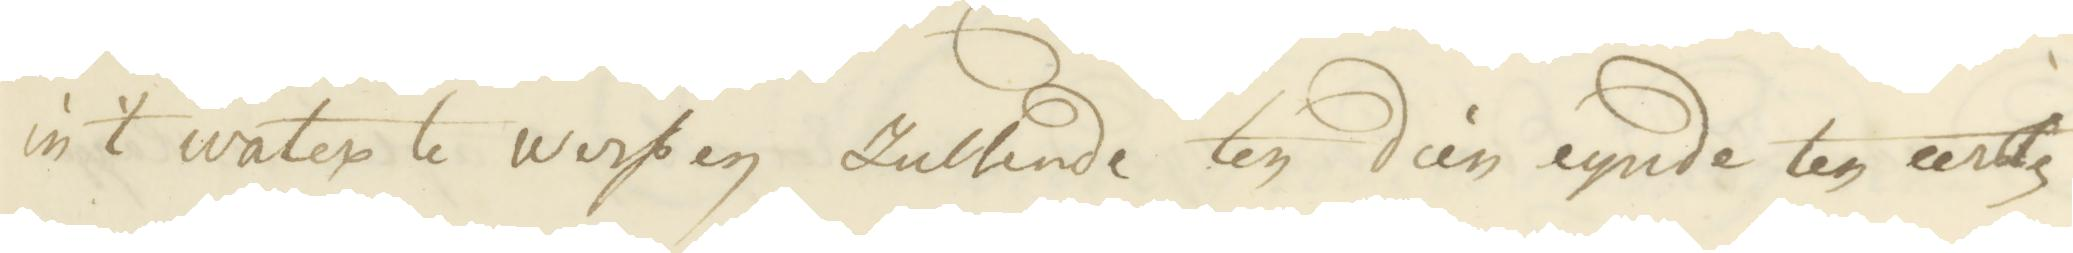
in ’t water te werpen zullende ten dien eynde ten eersten
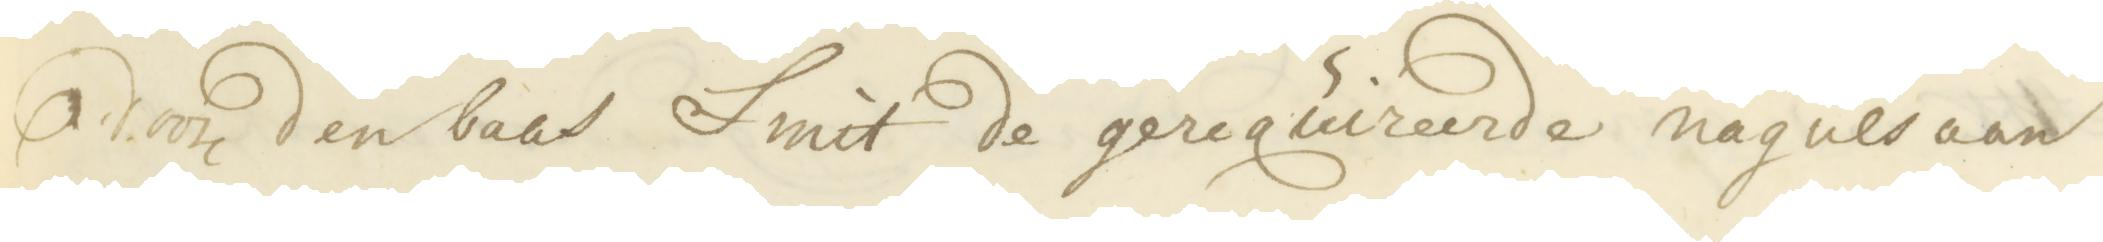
door den baas Smit de gerequireerde naguls aan
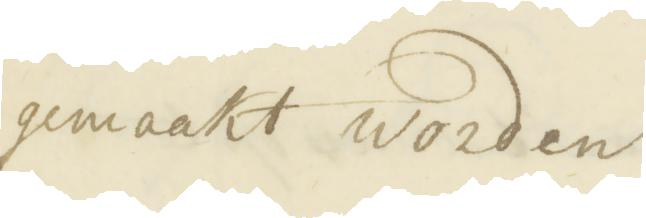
gemaakt worden
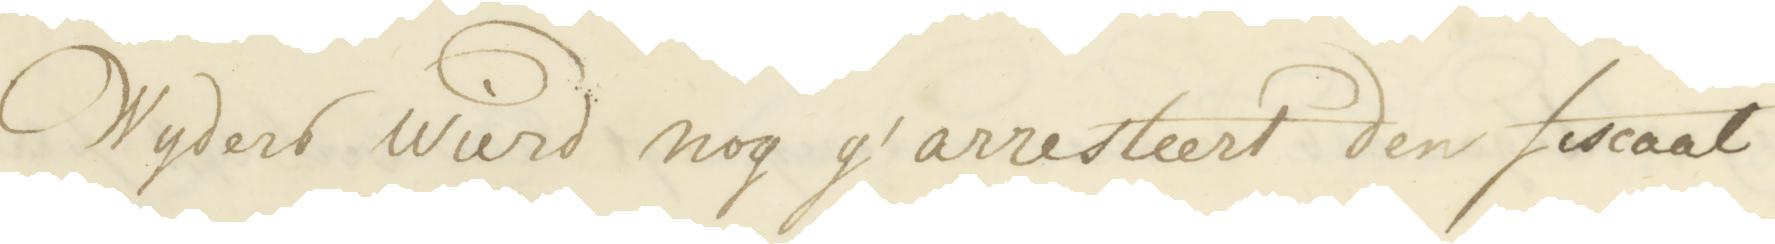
Wyders wierd nog g’arresteert den fiscaal
